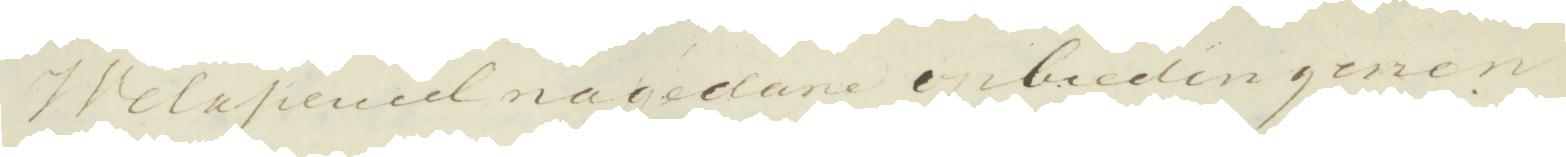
Welk perceel nagedane opbiedingen en
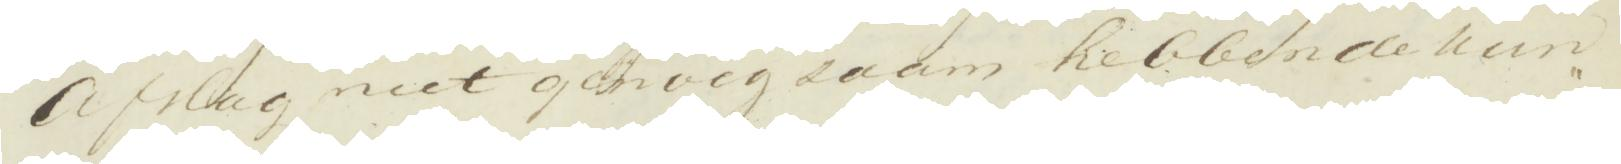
Afslag niet genoeg zaam hebbende kun„
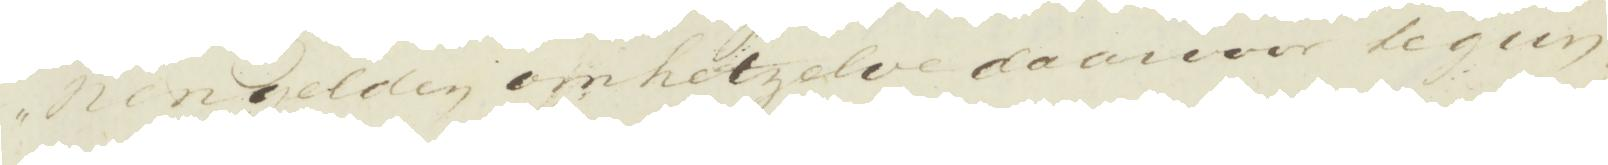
„nen gelden om hetzelve daarvoor te gun
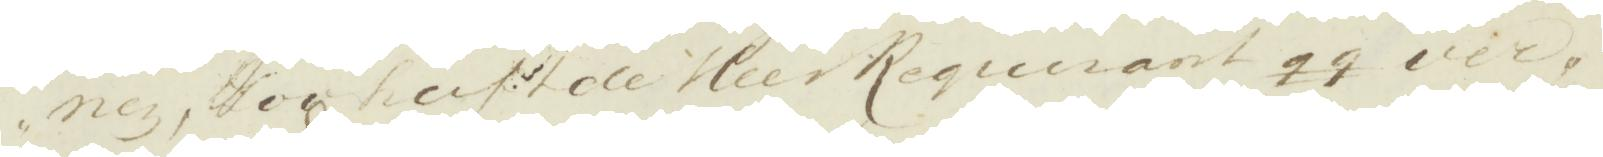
„nen, zoo heeft de Heer Requirant qq ver„
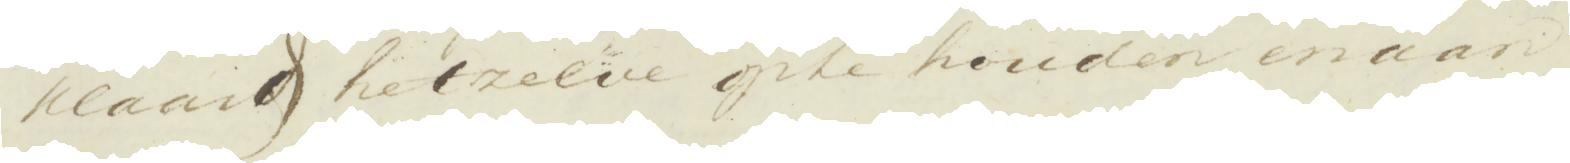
klaard hetzelve opte houden en aan
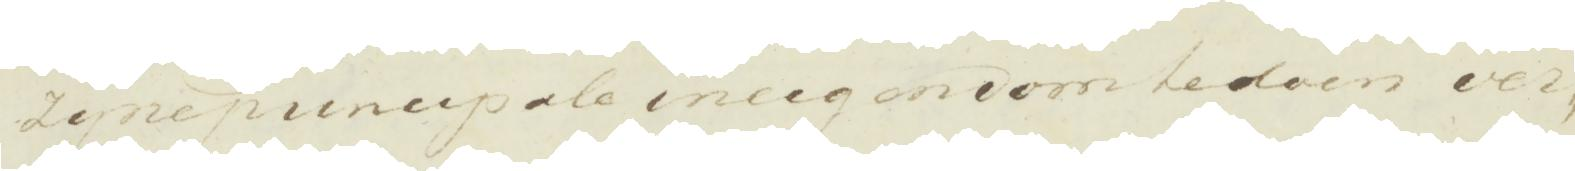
zyne principale ineigendom te doen ver
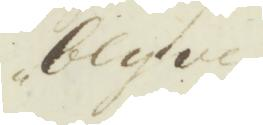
„blyve
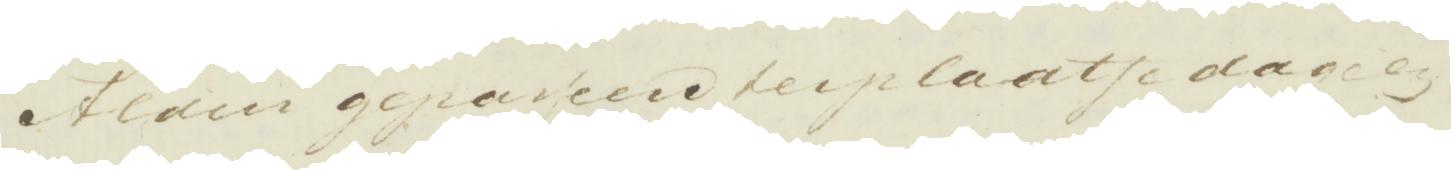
Aldus gepasseerd ter plaatse dage en
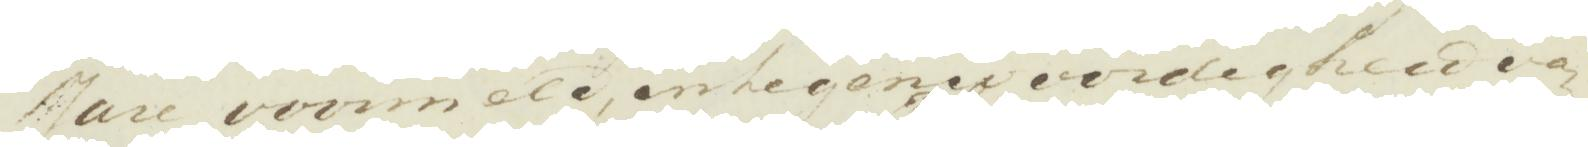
Jare voormeld, integenwoordigheid van
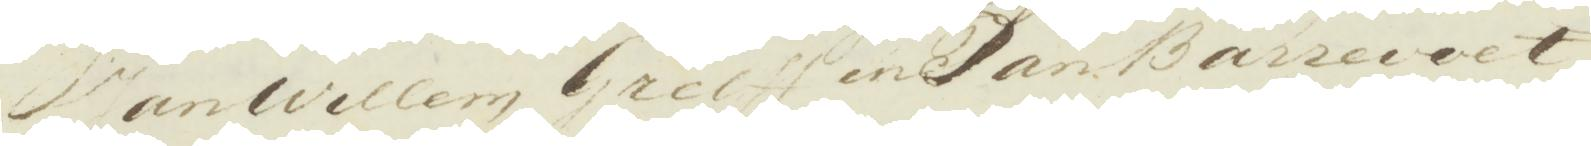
Jan Willem Greeff en Ian Barrevoet
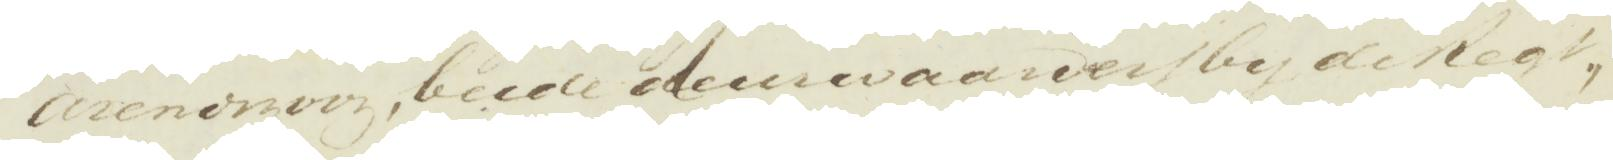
Arendszoon, beide deurwaarders bij de Regt„
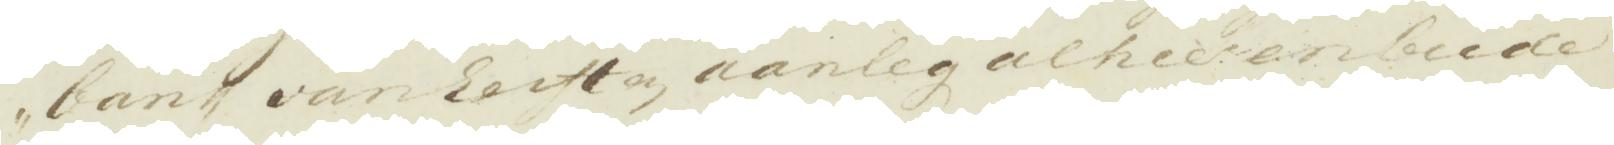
„bank van Eersten aanleg alhier en beide
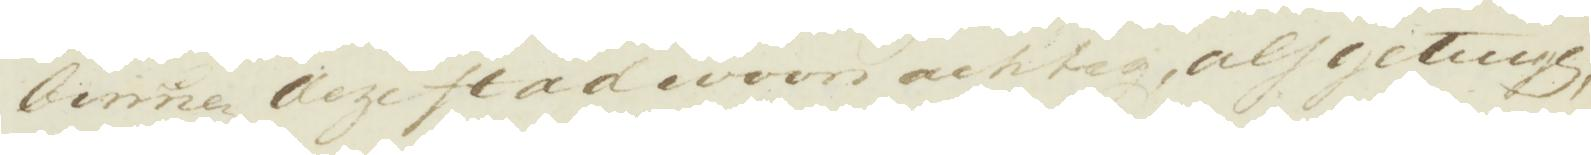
binnen deze stad woon achtig, als getuigen
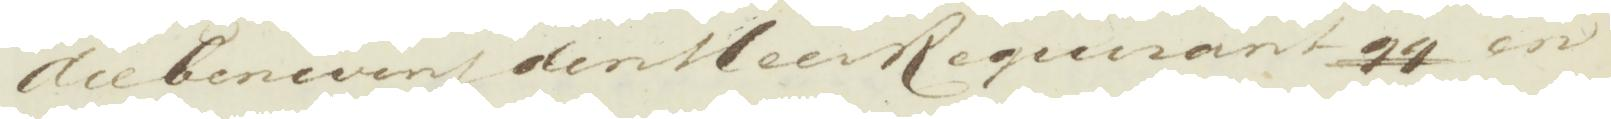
die benevens den Heer Requirant qq en
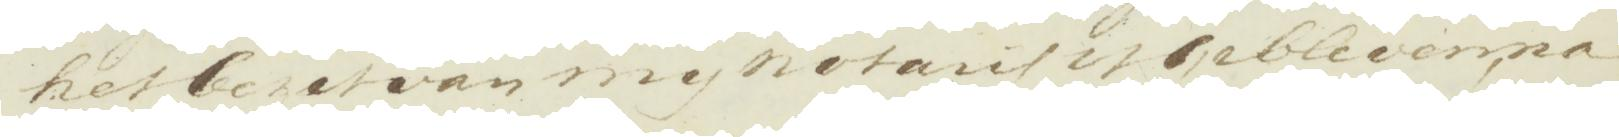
het bezit van mij notaris is gebleven, na
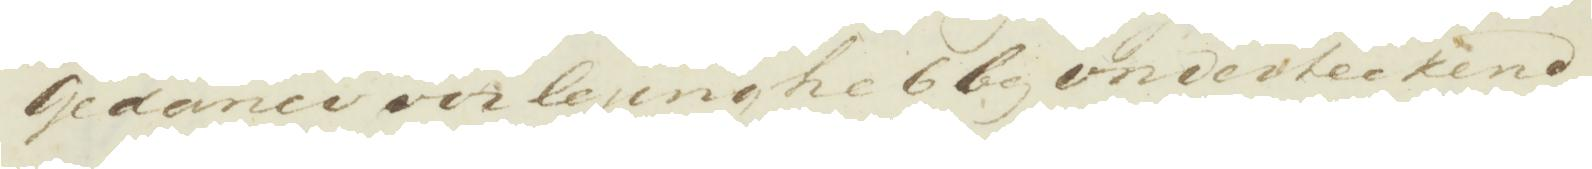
Gedane voorlezing hebben onderteekend
